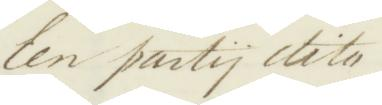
Een partij dito
